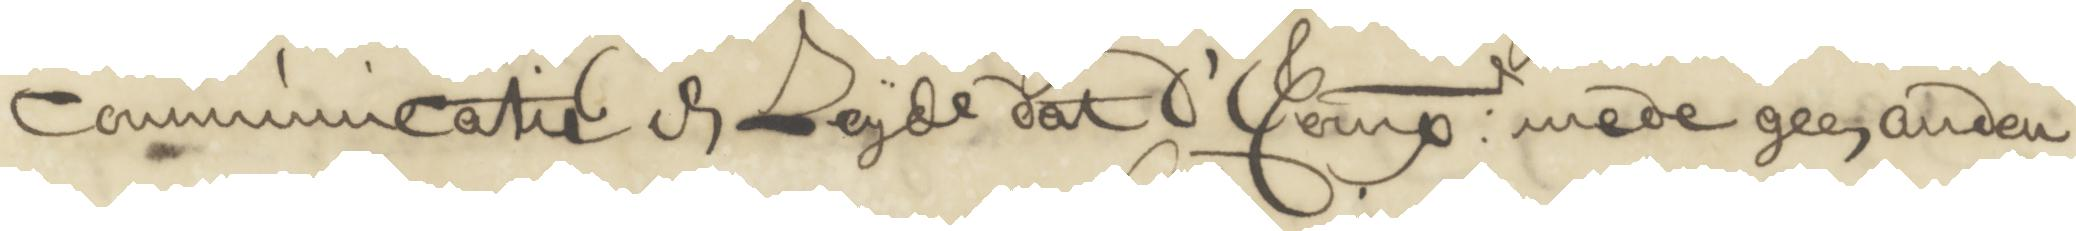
Communicatie en zeijde dat d’ EComp: mede geenander
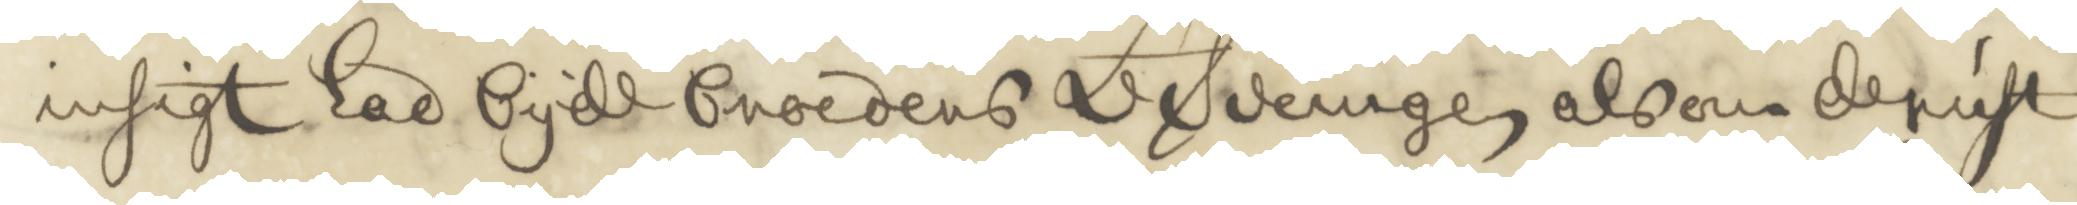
insigt had bijde broeders te vereenigen als om de rust
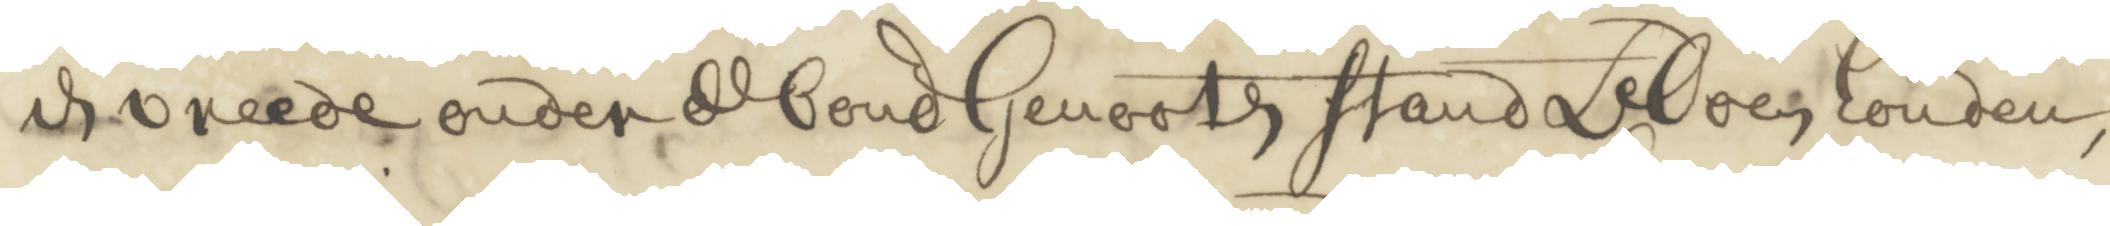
en vreede, onder de bond Genooten stand te doen houden,
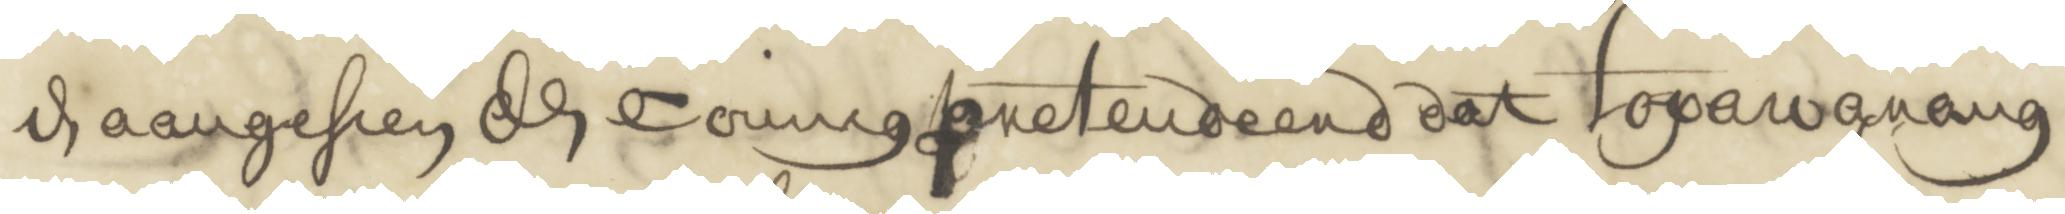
en aangesien den Coning pretendeerd dat Topawarang
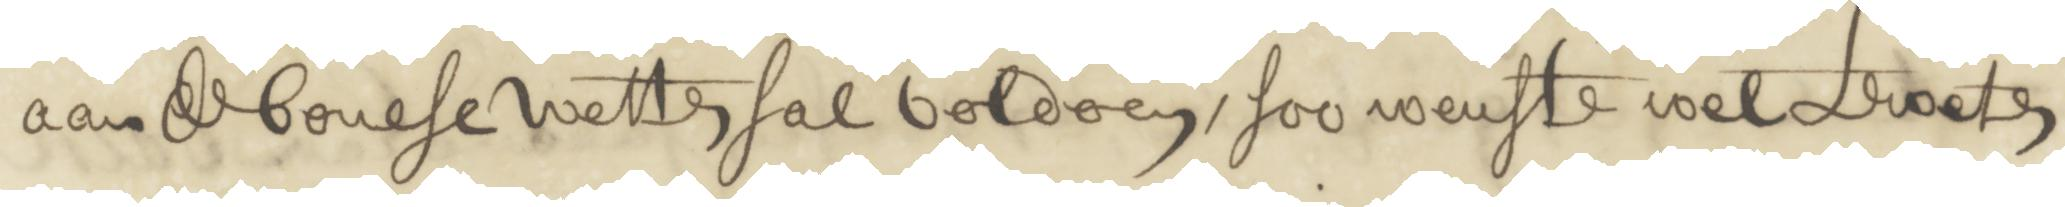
aan de bonese wetten sal voldoen, soo wenste wel teweten
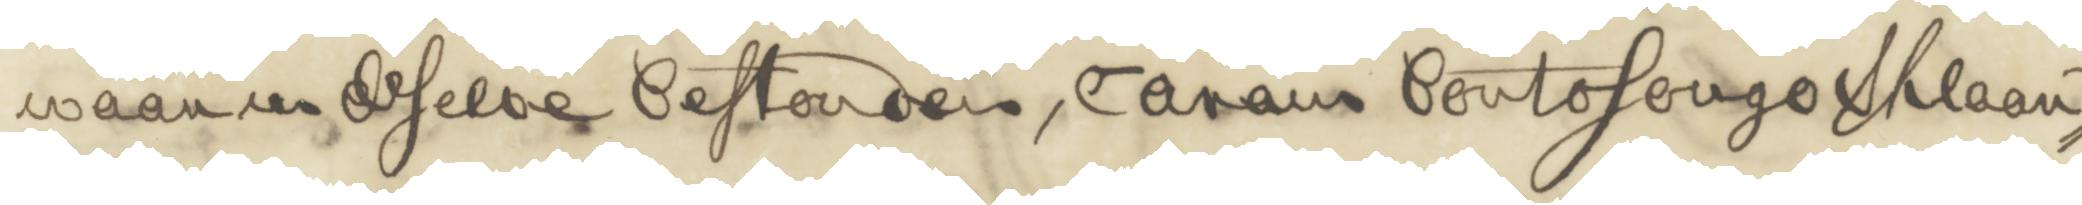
waar in deselve bestonden, Carain bontosongo verklaar„
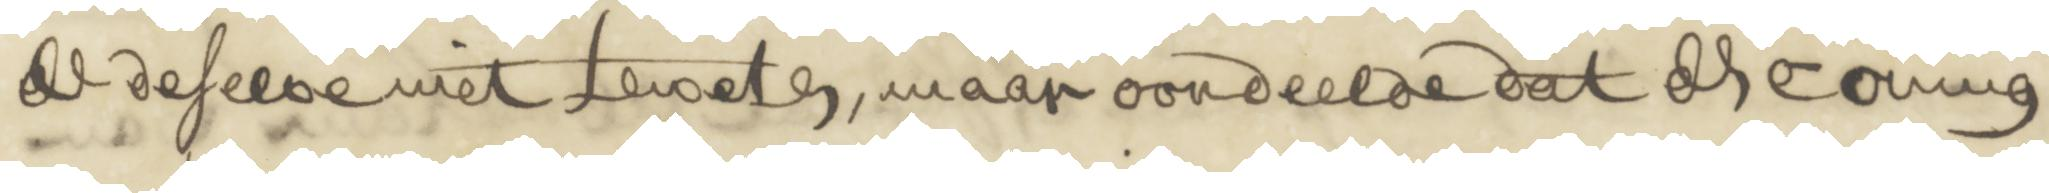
de deselve niet teweten, maar oordeelde dat den Coning
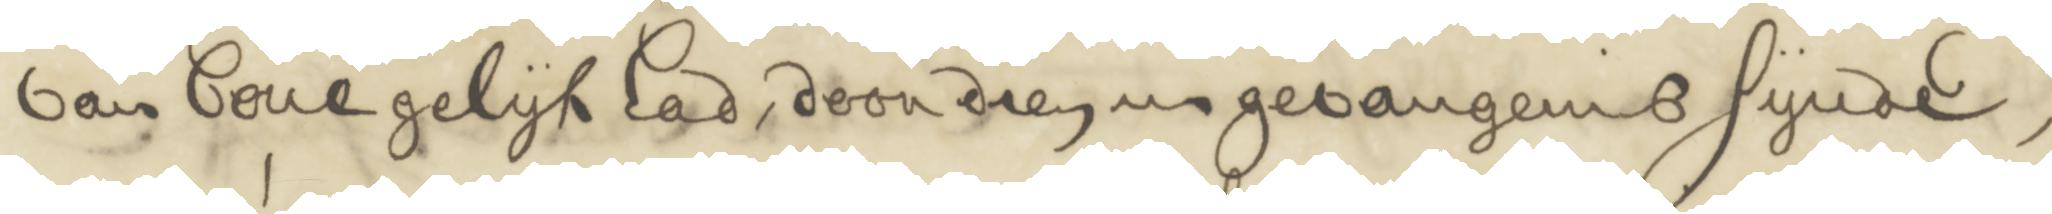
van bone gelijk had, door dien in gevangenis sijnde,
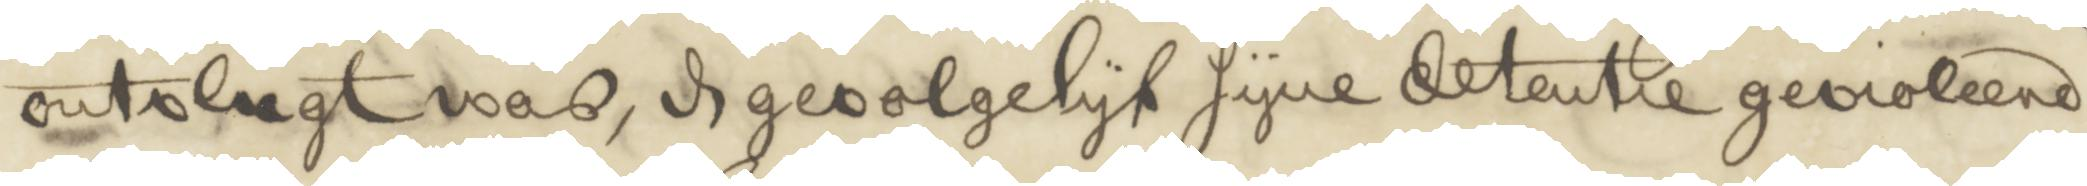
ontvlugt was, en gevolgelijk sijne detentie gevioleerd
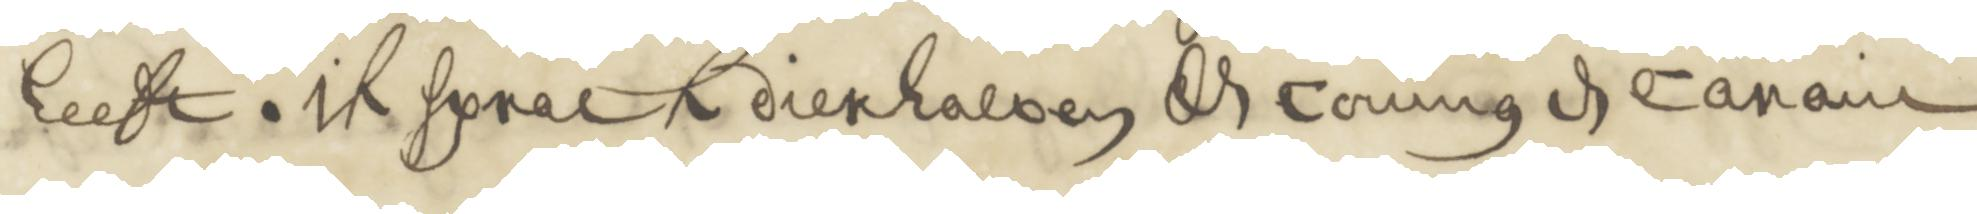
heeft. ik sprack dierhalven den Coning en Carain
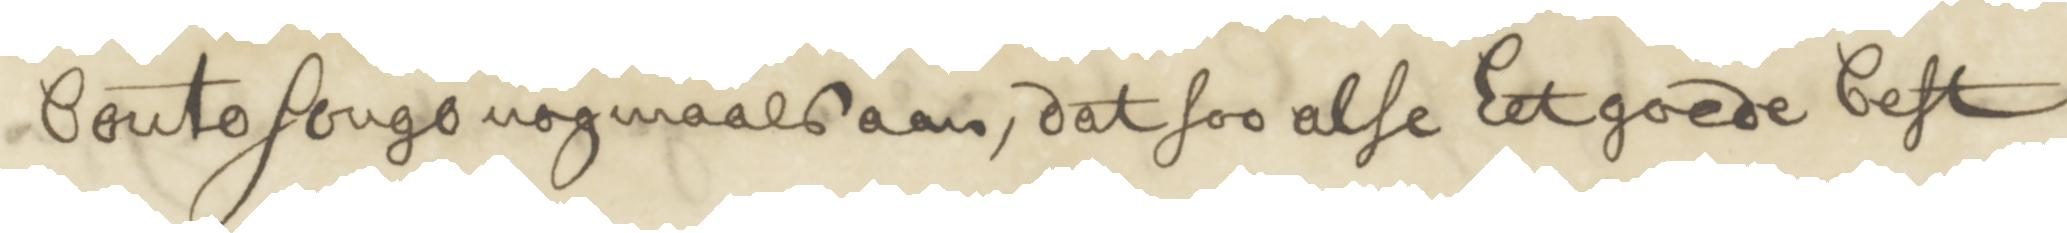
bonto songo nogmaals aan, dat soo alse het goede best
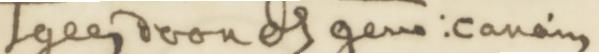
't geen door den gem: carain
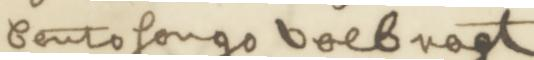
bonto songo volbragt
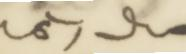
is, en
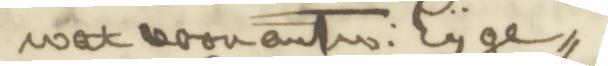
wat voor antw: hij ge„
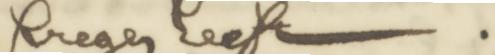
kregen heeft.
